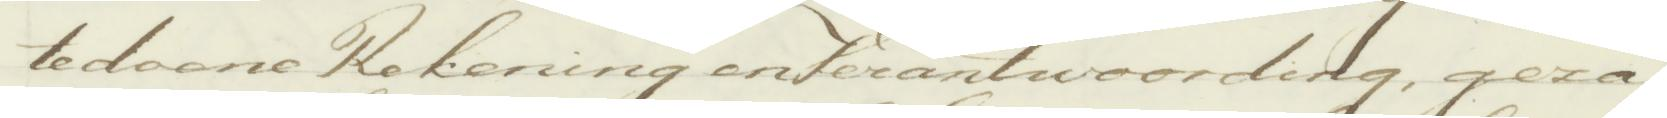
te doene Rekening en Verantwoording, geza
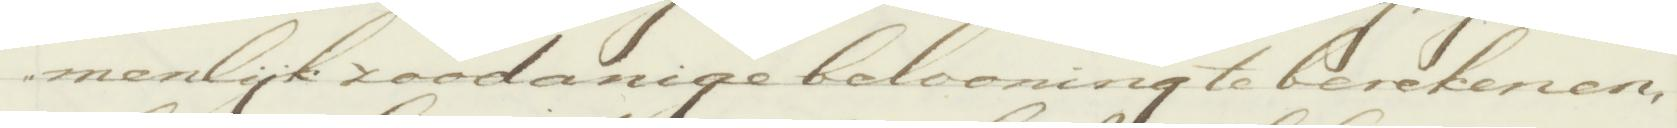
„menlijk zoodanige belooning te berekenen,
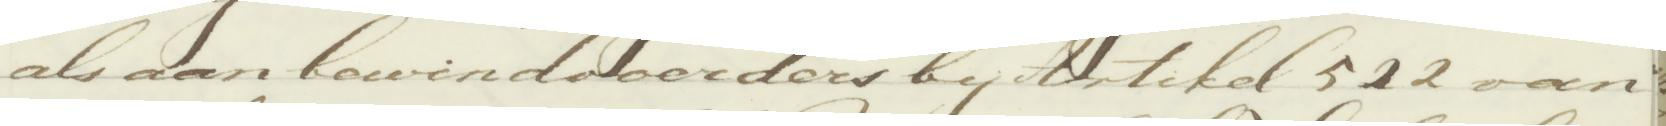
als aan bewindvoerders bij Artikel 522 van
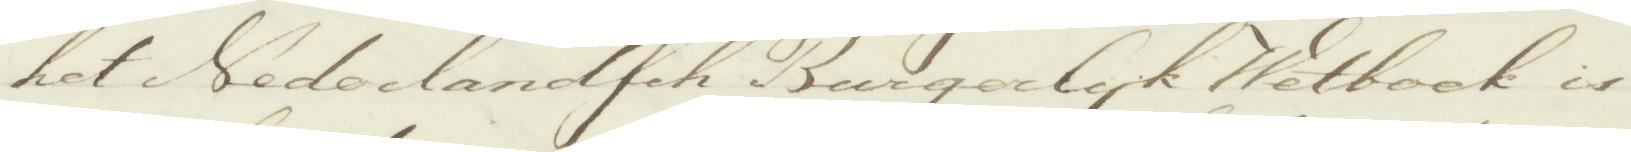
het Nederlandsch Burgerlijk Wetboek is
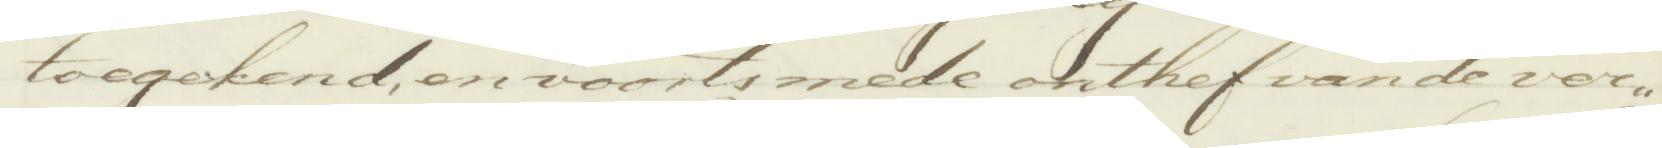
toegekend, en voorts mede onthef van de ver„
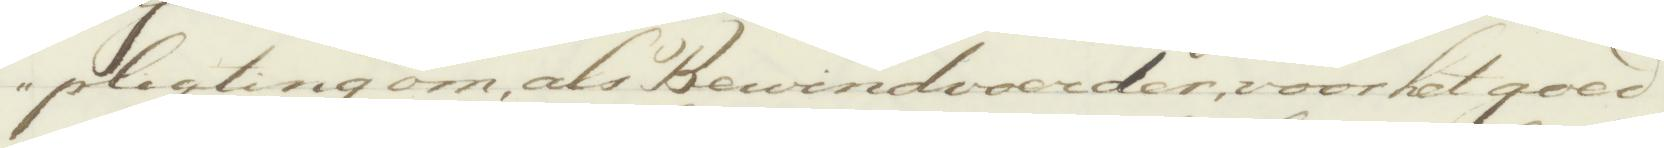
„pligting om, als Bewindvoerder, voor het goed
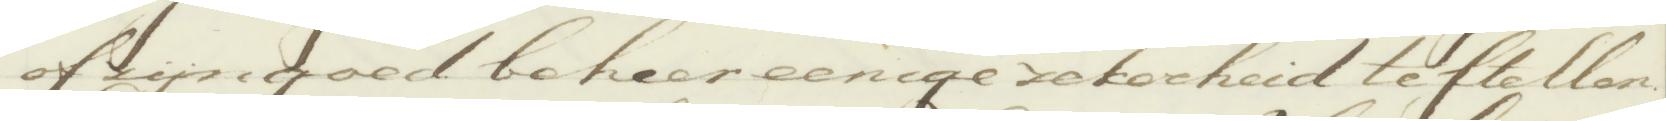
of zijn goed beheer eenige zekerheid te stellen
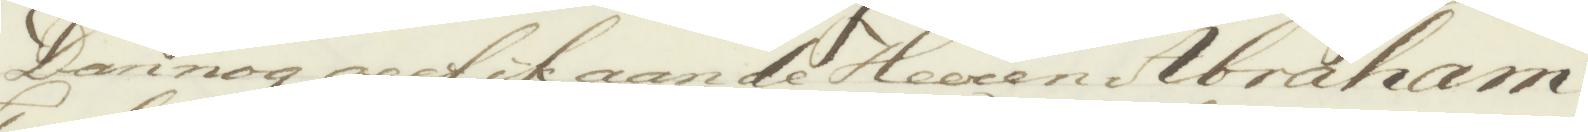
Dan nog geef ik aan de Heeren Abraham
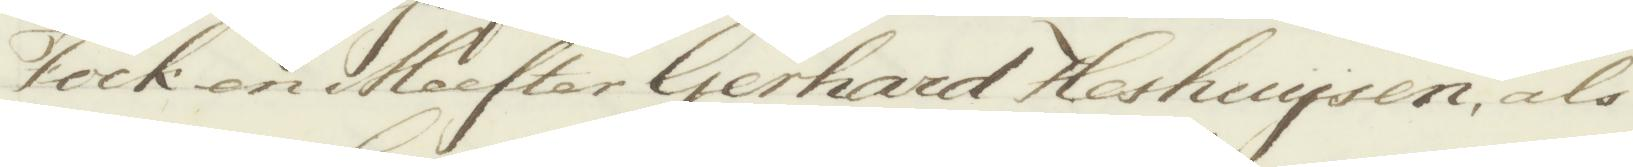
Fock en Meester Gerhard Heshuijsen, als
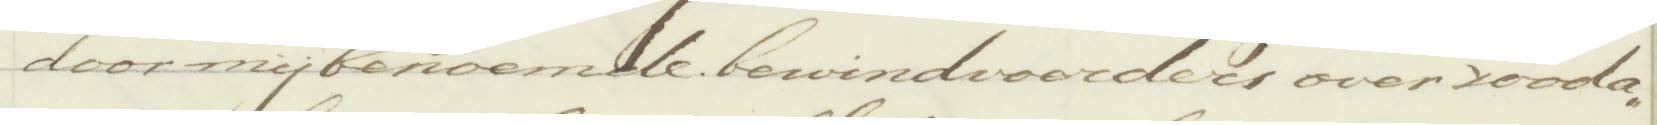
door mij benoemde bewindvoerders over zooda„
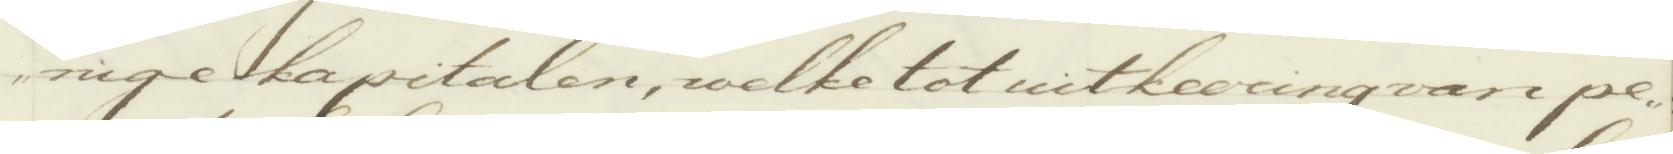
„nige kapitalen, welke tot uitkeering van pe„
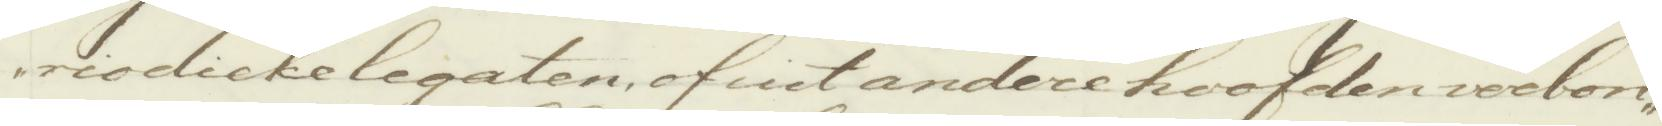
„riodieke legaten, of uit andere hoofden verbon„
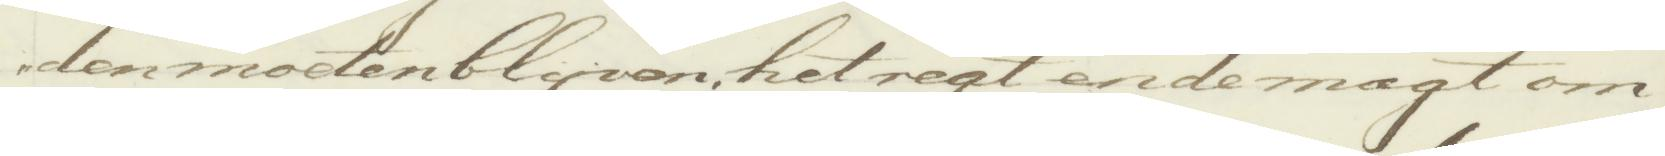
„den moeten blijven, het regt en de magt om
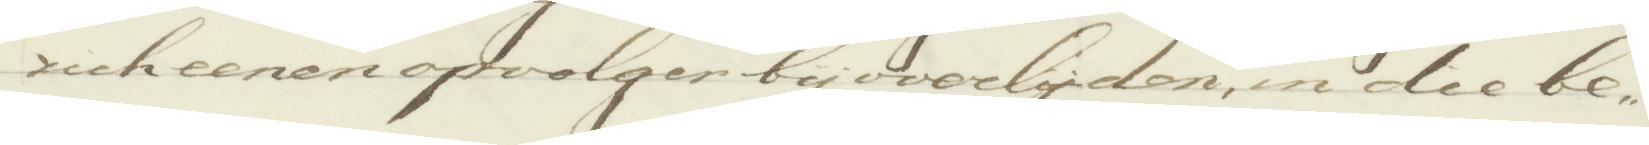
zich eenen opvolger bij overlijden, in die be„
